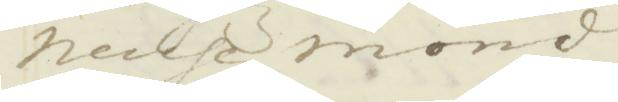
Neus en mond
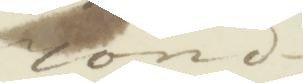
rond
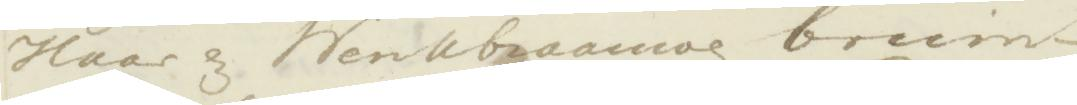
Haar en Wenkbraauwen bruin
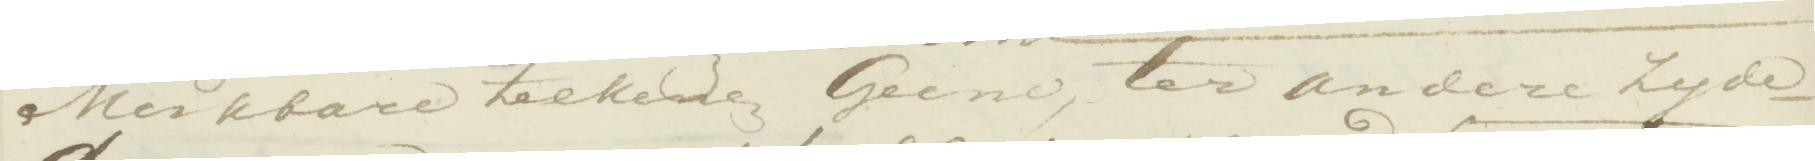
Merkbare teekenen Geene, ter andere zyde
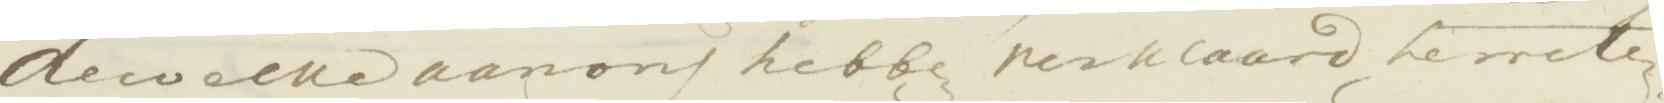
dewelke aan ons hebben verklaard te weten
